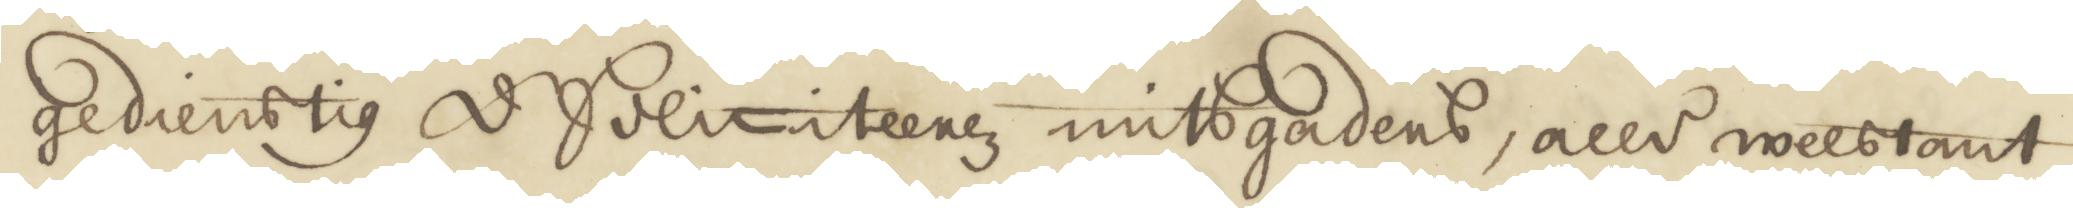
gedienstig te feliciteeren mitsgaders, alle welstant
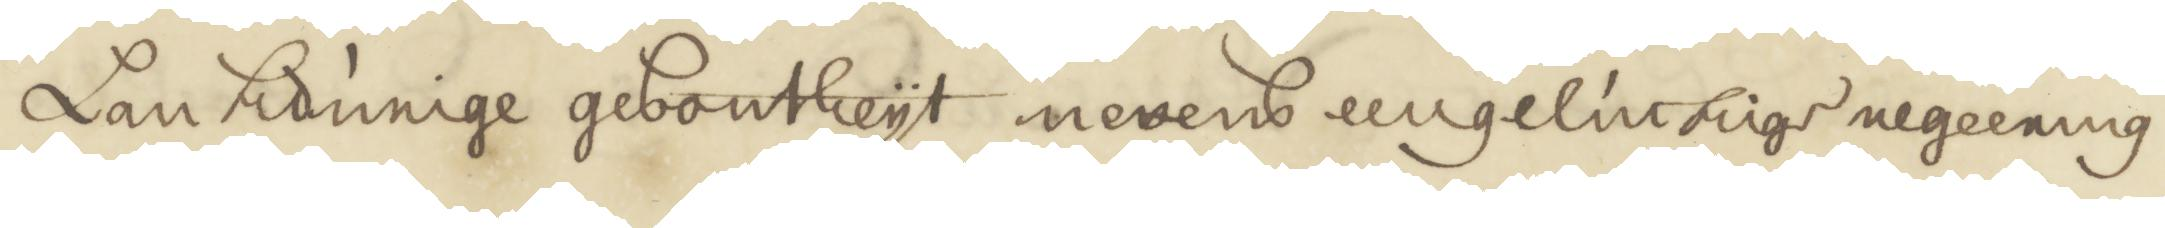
Lankdurige gesontheijt nevens een geluckige regeering
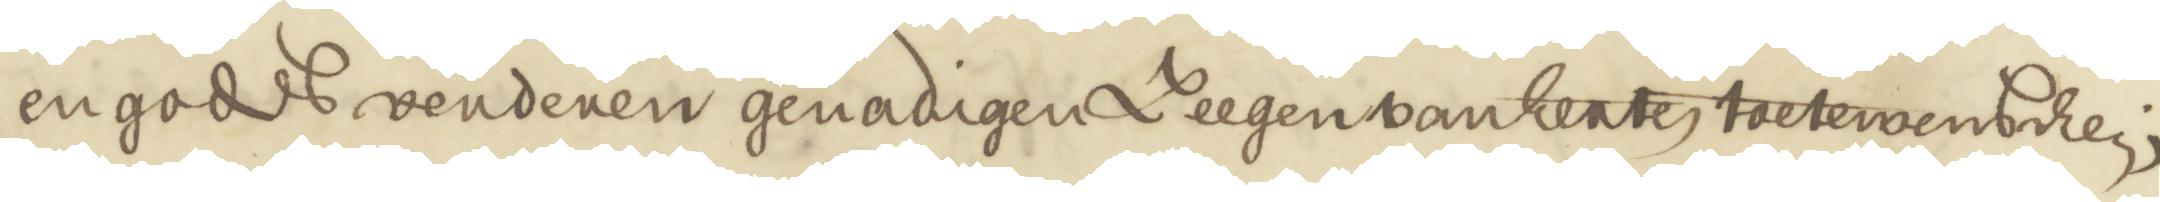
en godes verderen genadigen Zeegen van herten toe te wenschen;
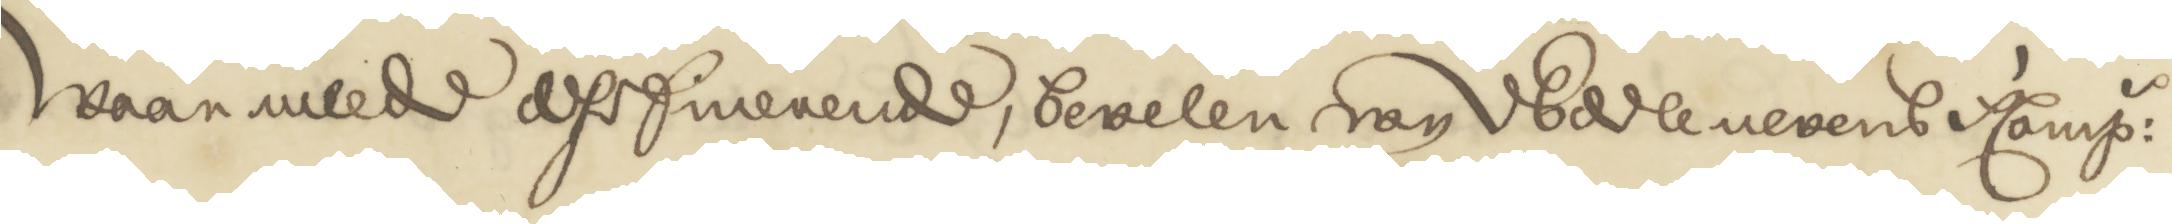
waar meede dese finerende, bevelen wy VEdele nevens 'SComp:s
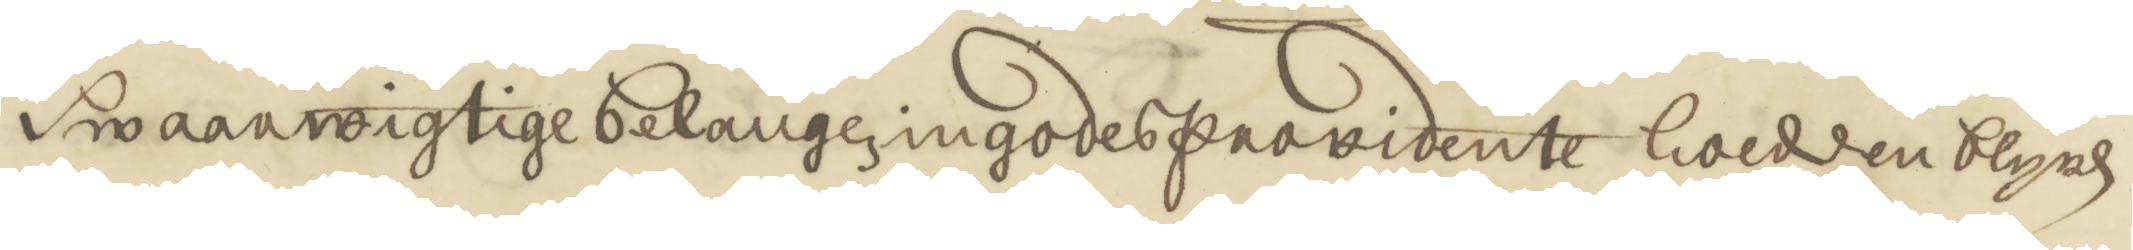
Swaarwigtige belangen in godes providente hoede en blyven
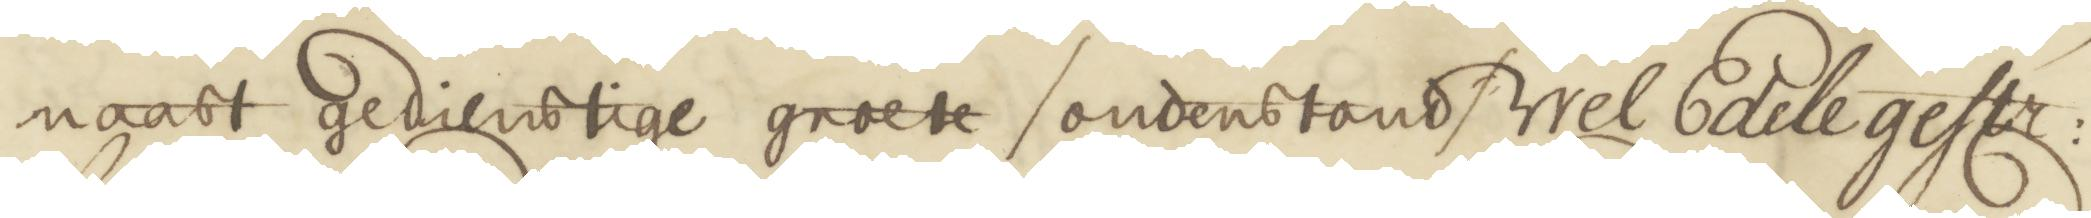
naast gedienstige groete / onderstond / Wel Edele gestr:
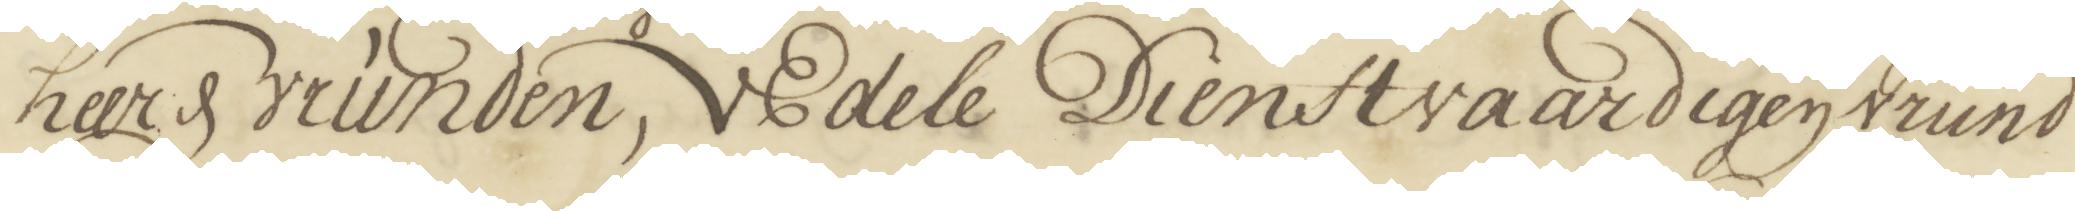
heer en vrunden, VE dele Dienstvaardigen vrund
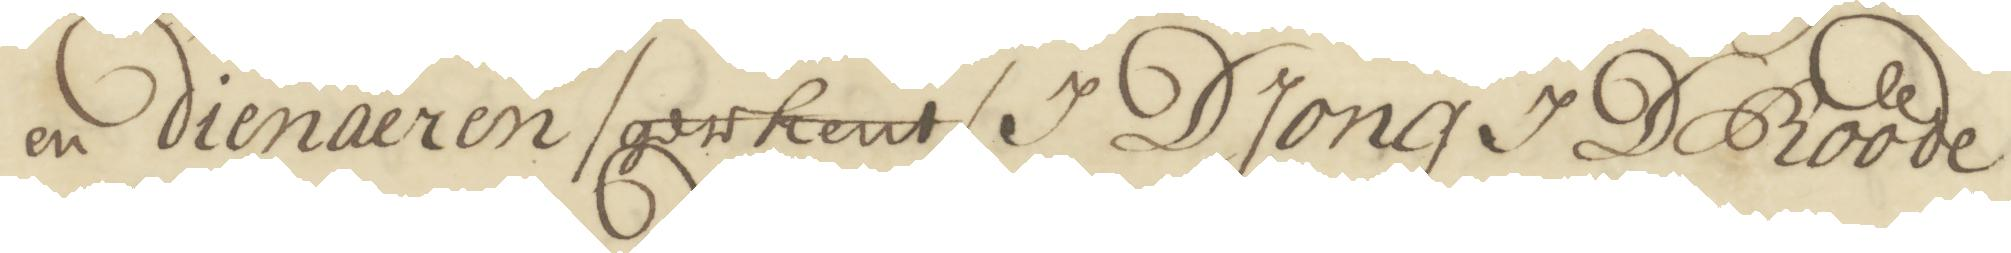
en dienaeren / getekent / I D Jong I D Boode
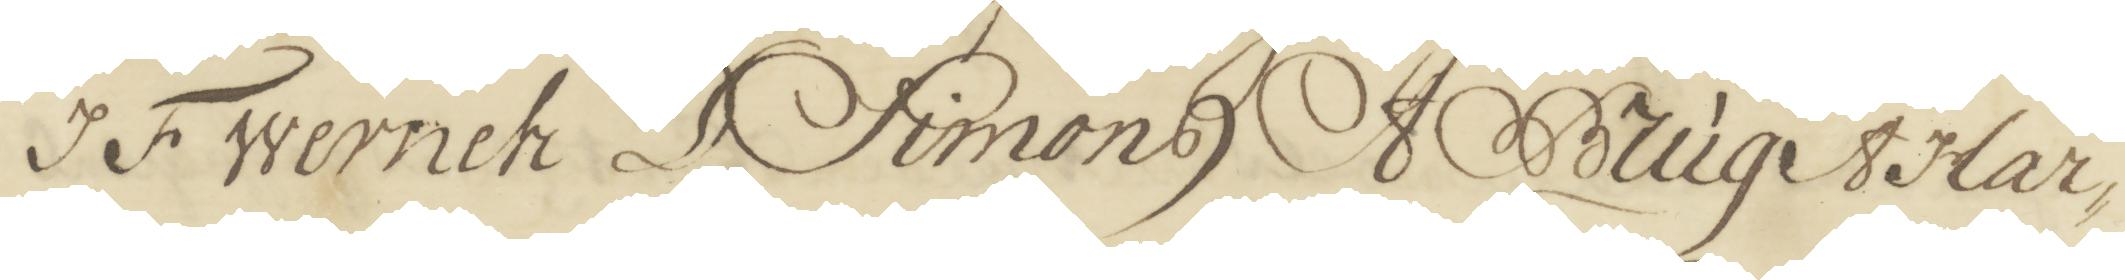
I F wernek D Simons A Brug A Har„
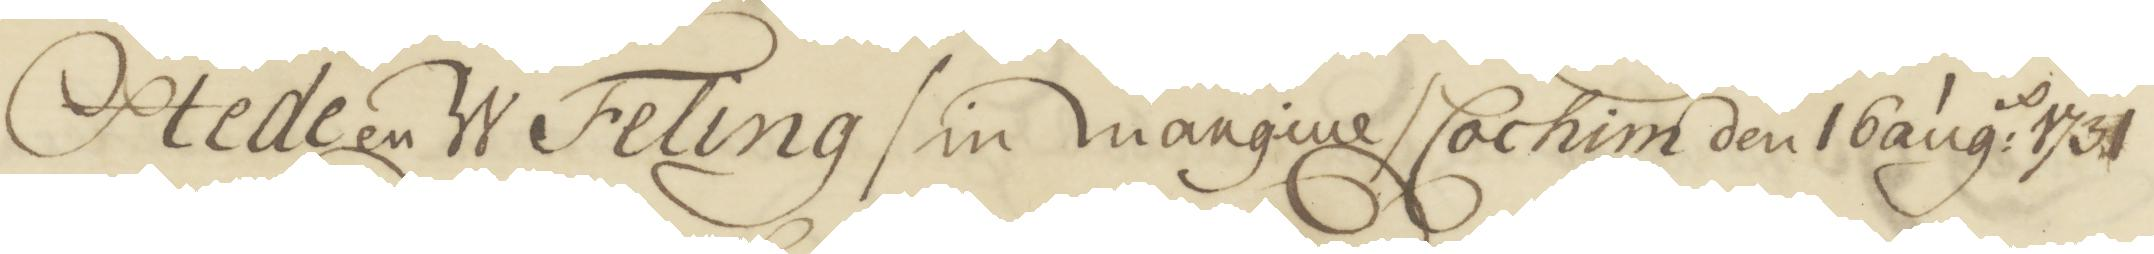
Stede en W Feling / in margine / Cochim den 16 aug:s 1731
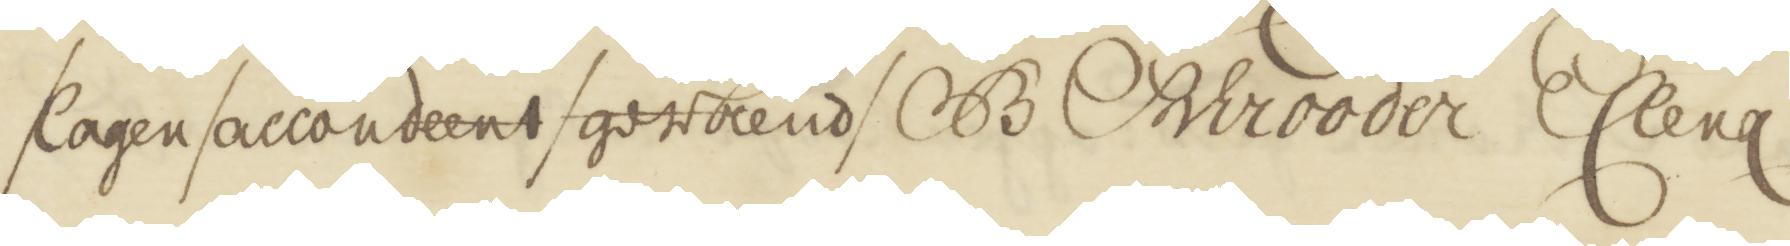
/ lager / accordeert /getekend/ B Schrooder EClerq
